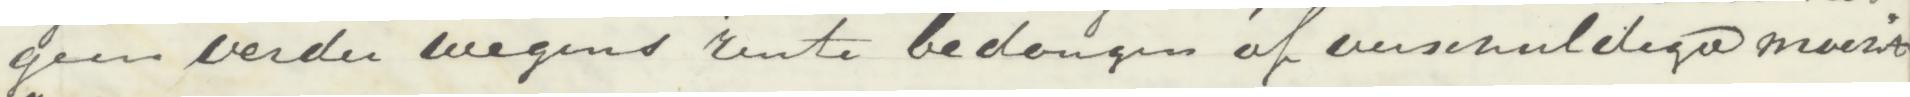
geen verder wegens rente bedongen of verschuldig mocht
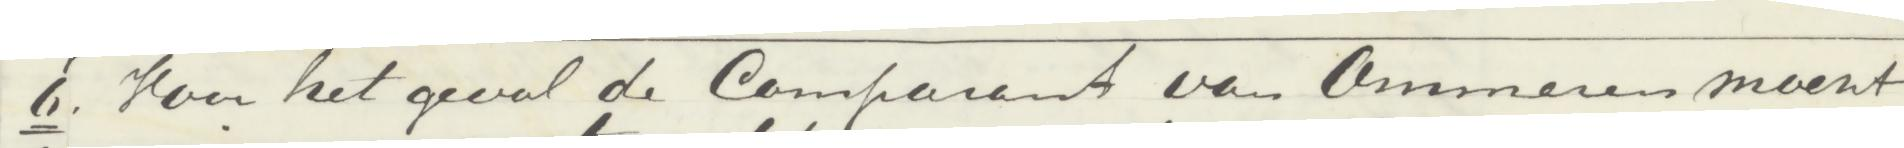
6. Voor het geval de Comparant van Ommeren mocht
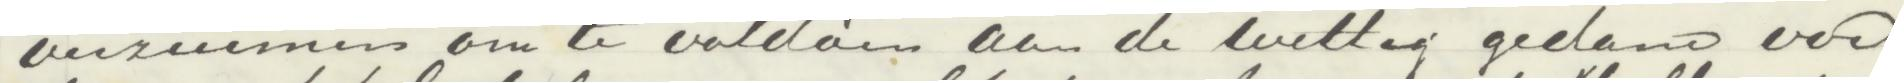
verzuimen om te voldoen aan de wettig gedane vor
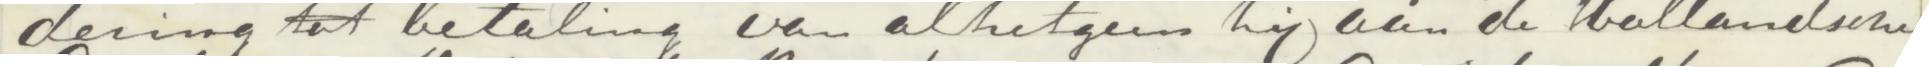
dering tot betaling van alhetgeen hij aan de Hollandsche
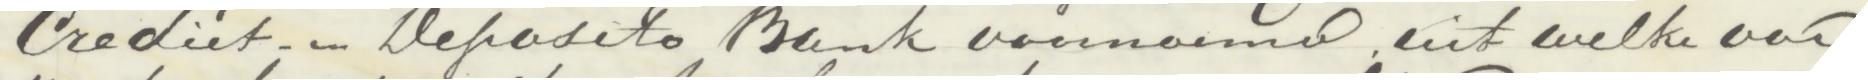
Crediet- en Deposito Bank voornoemd, uit welke oor
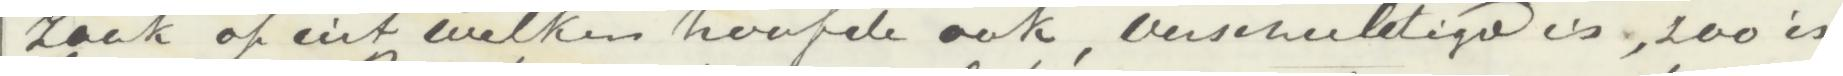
zaak of uit welken hoofde ook verschuldigd is, zoo is
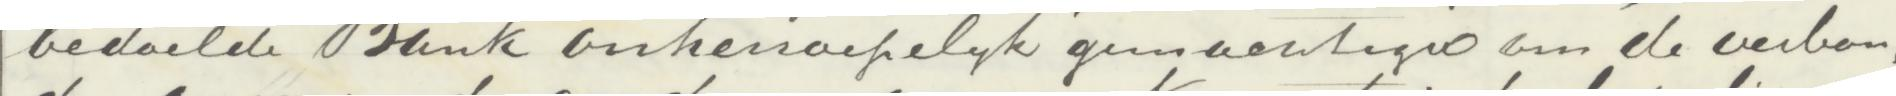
bedoelde Bank onherroepelyk gemachtigd om de verbon
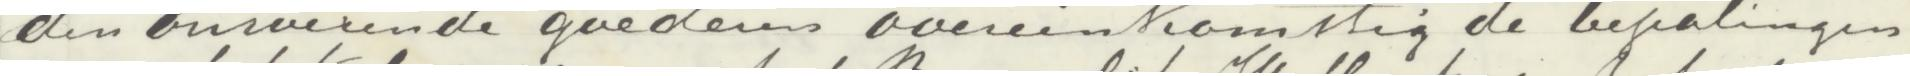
den onroerende goederen overeenkomstig de bepalingen
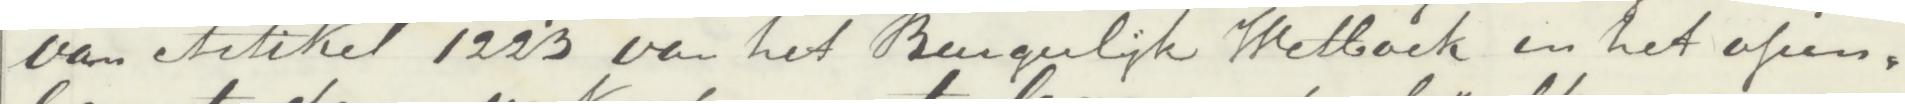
van Artikel 1223 van het Burgerlijk Wetboek in het open„
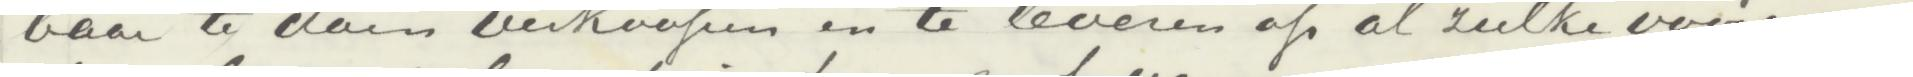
baar te doen verkoopen en te leveren op al zulke voorwaar,
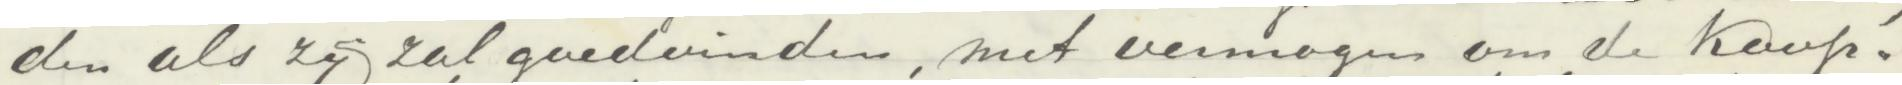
den als zij zal goedvinden, met vermogen om de koop„
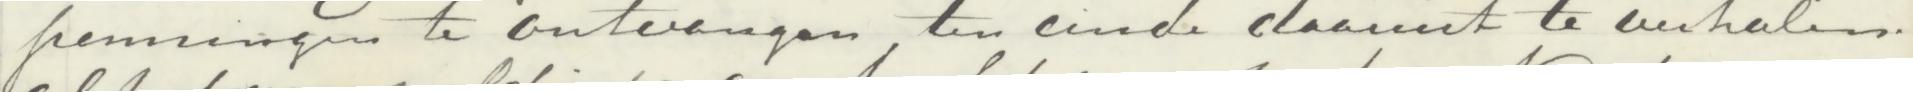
penningen te ontvangen, ten einde daaruit te verhalen
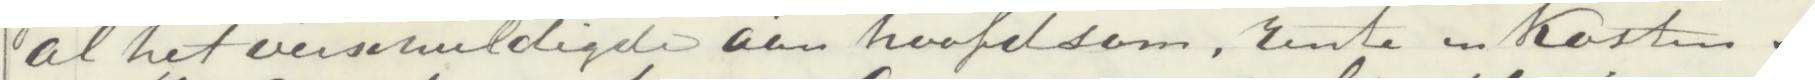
al het verschuldigde aan hoofdsom, rente en kosten.
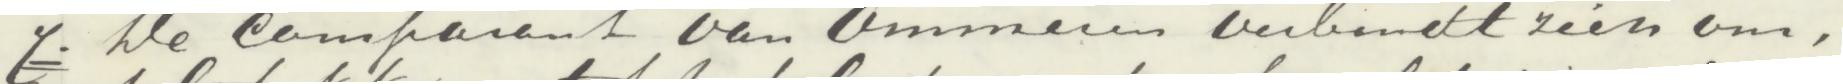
7. De Comparant van Ommeren verbindt zich om,
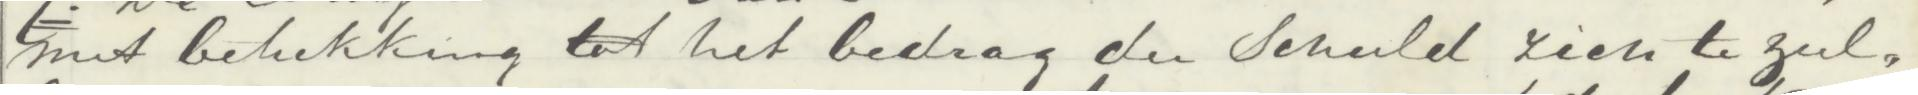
met betrekking tot het bedrag der schuld zich te zul„
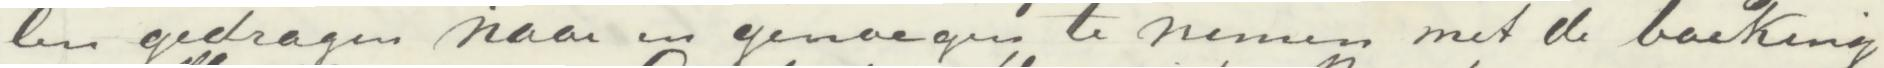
len gedragen naar en genoegen te nemen met de boeking
